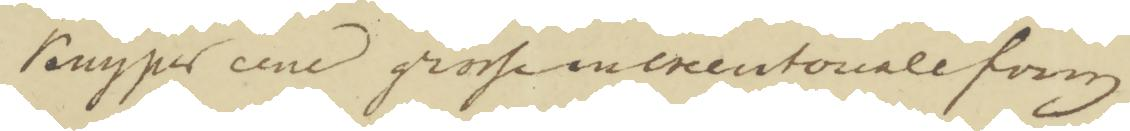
Kuyper eene grosse in executoriale form.
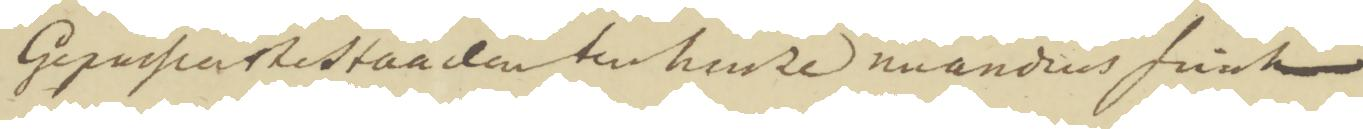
Gepasseert te Haarlem ten huize van andries frink
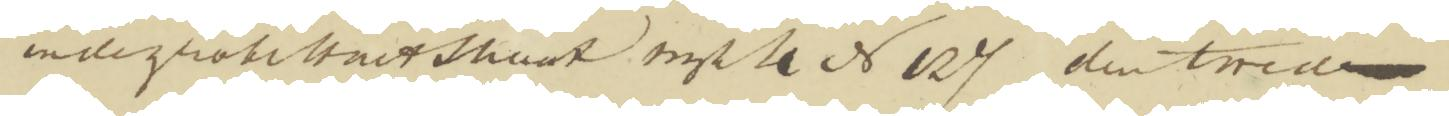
in de grote Houtstraat wyk 4 N 127 den twede
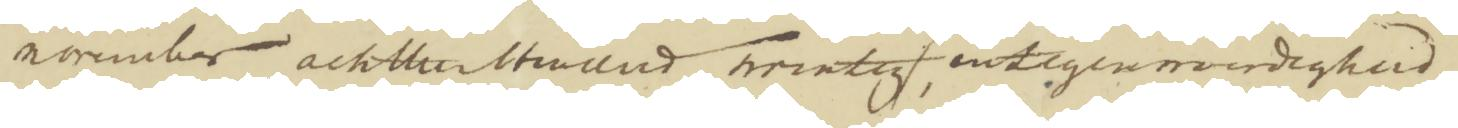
november achttien Honderd twintig, integenwoordigheid
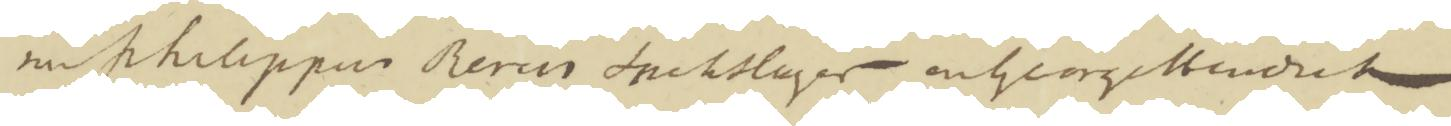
van Philippus Reven spekslager en George Hendrik
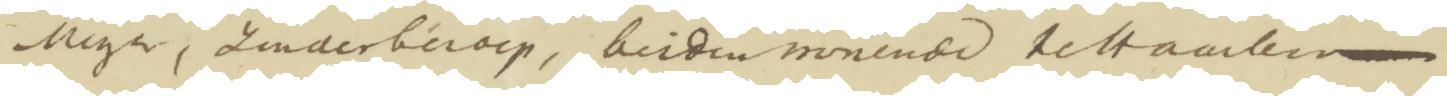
Meyer, zonder beroep, beiden wonende te Haarlem
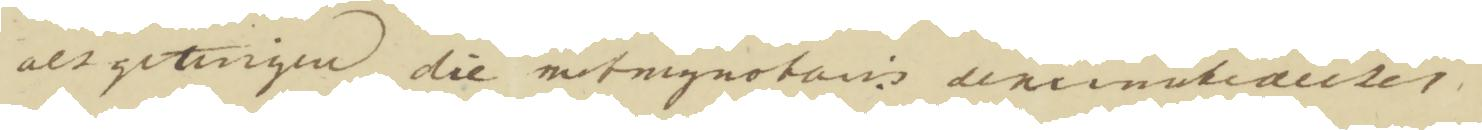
als getuigen die met my notaris de minute deezes
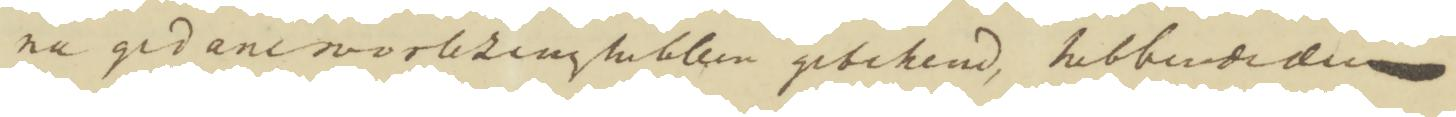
na gedane voorlezing te hebben getekend, hebbende den
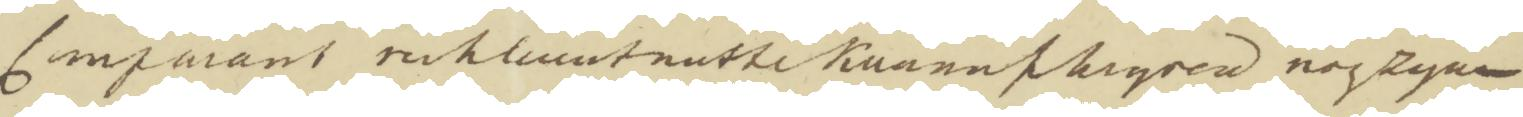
Comparant verklaart niet te kunnen schryven nog zyne
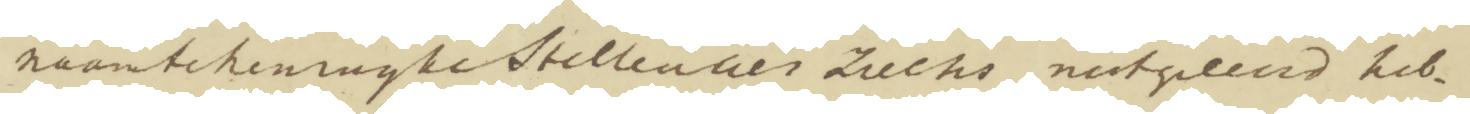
naam tekening te stellen zulks niet geleerd heb,
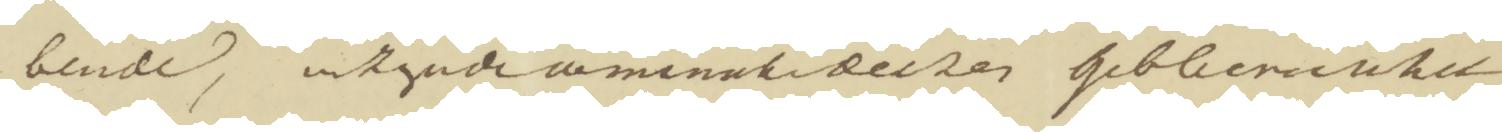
bende, in zynde de minute dezes gebleven in het
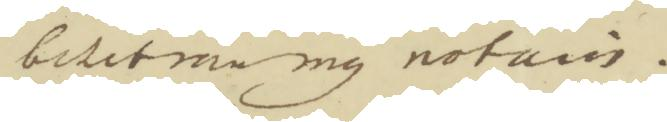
bezit van my notaris.
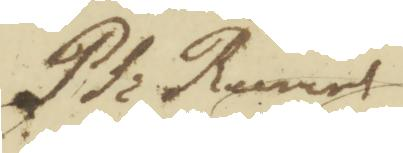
Ph: Reevers
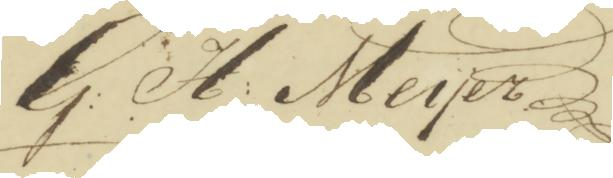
G: H: Meijer.
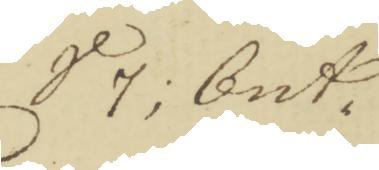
V7; Ont„
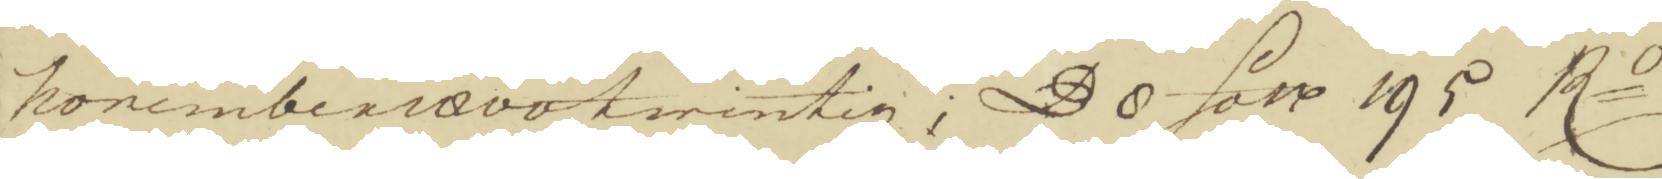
november 1800 twintig; D 8 folio 195 R=o
